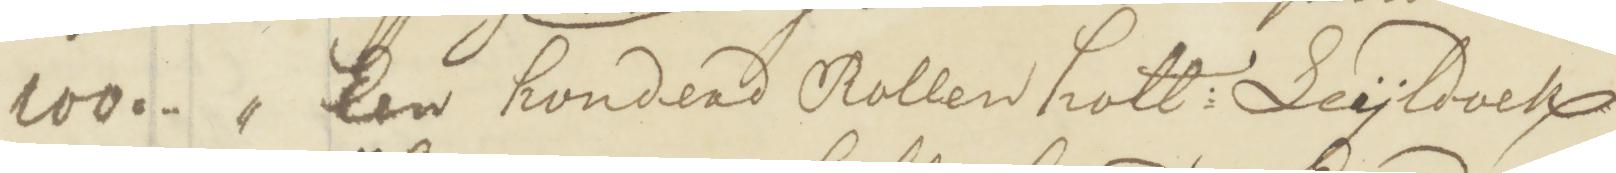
100. — „ Een honderd Rollen holl: Zeijldoek
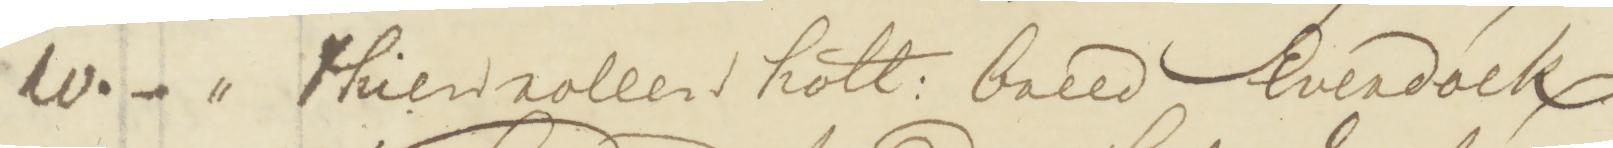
10. — „ thien rollen holl: breed Everdoek
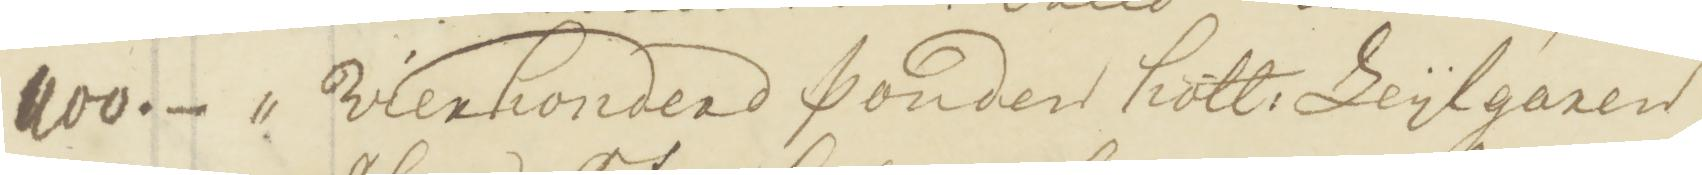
400. — „ vierhonderd ponden holl: Zeijlgaren
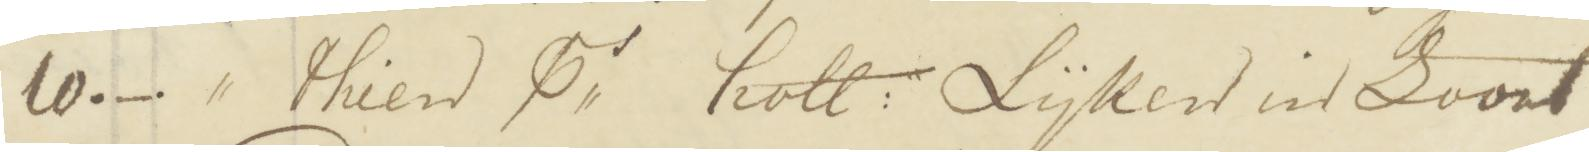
10. —. „ thien p„s holl: Lijken in Zoort
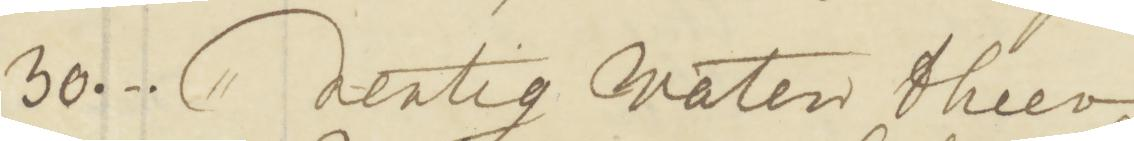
30. —. „ dertig vaten theer
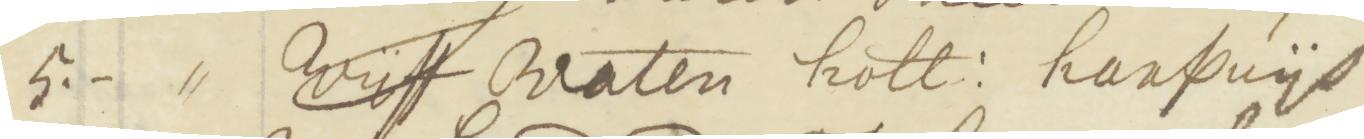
5. — „ vijff vaten holl: karpuijs
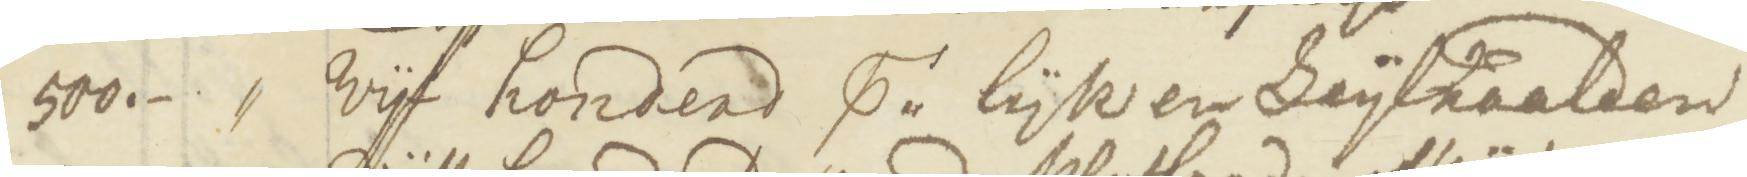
500. — „ vijf honderd p„s lijk en Zeijlnaalden
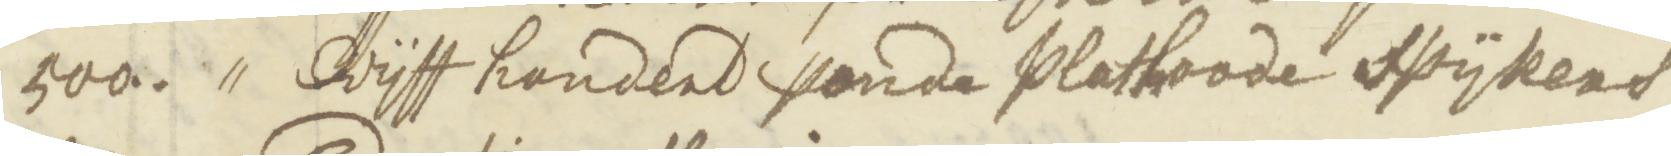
500. — „ vijff honderd ponde platloode spijkers
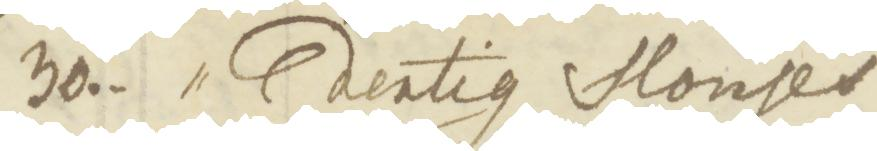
30. — „ dertig slonjes
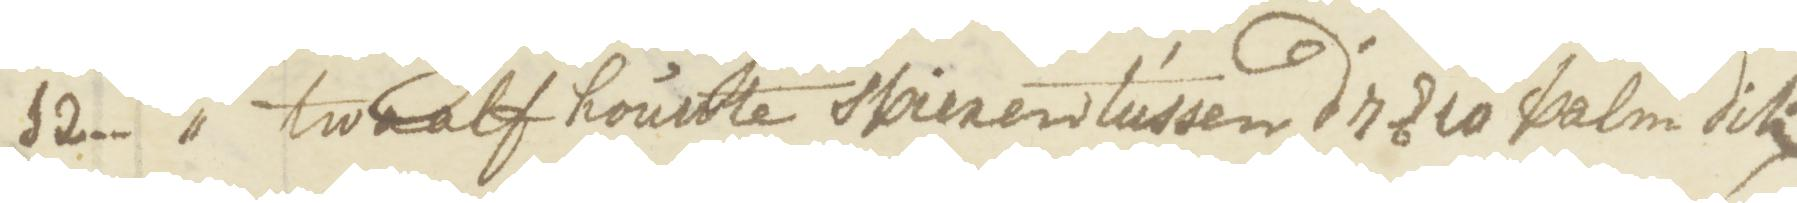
12. — „ twaalf houwte spieren tussen d' 7 &10 palm dik
